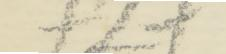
727
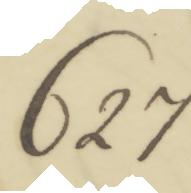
627
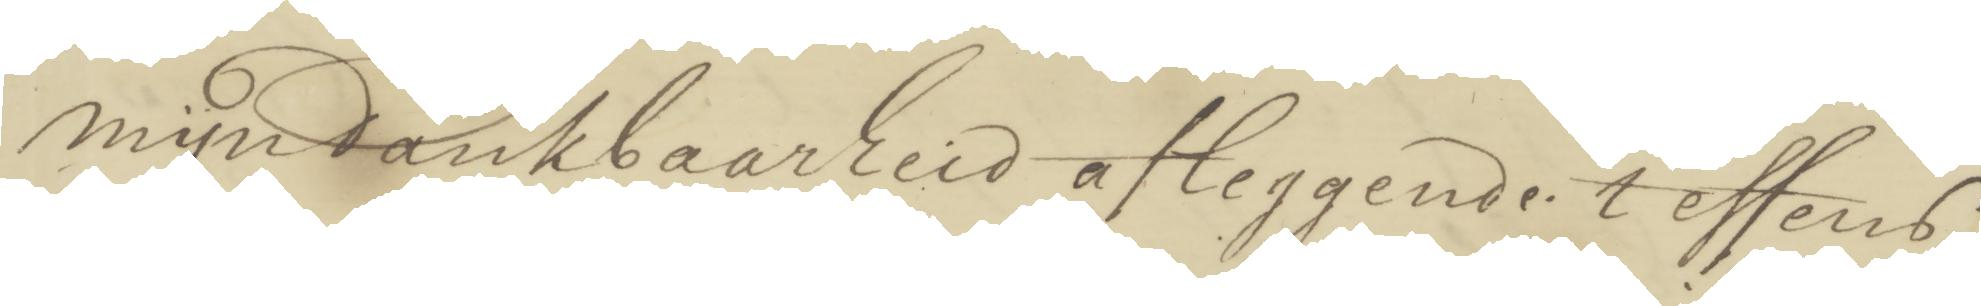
mijn dankbaarheid afleggende. ’t effens
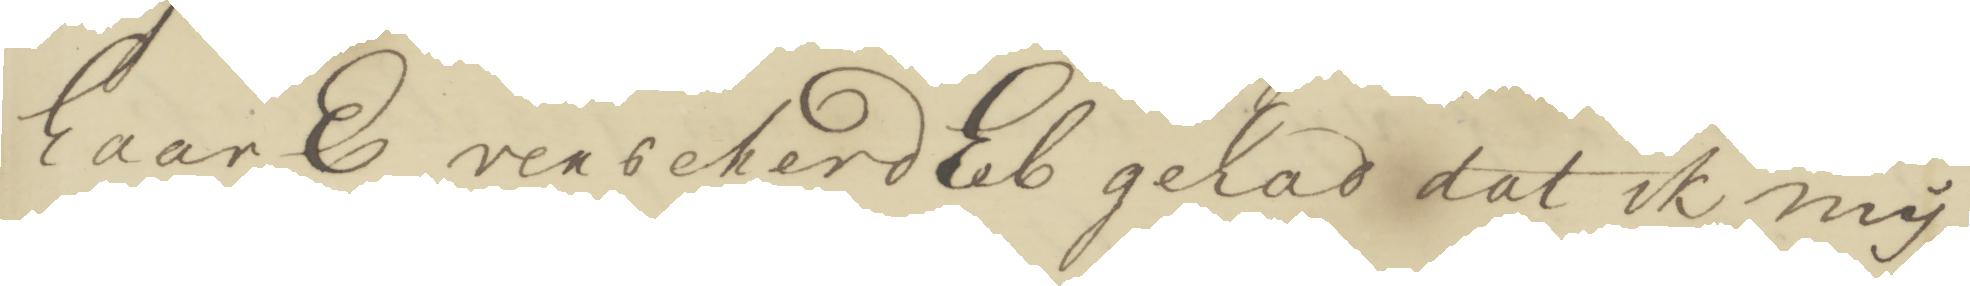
haar E versekerd heb gehad dat ik mij
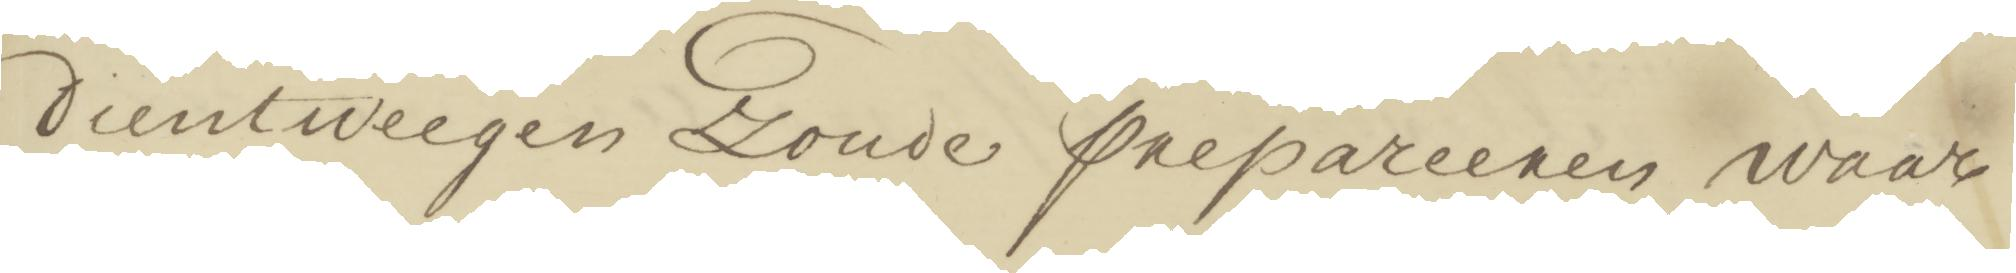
dientweegen Zoude prepareeren waar
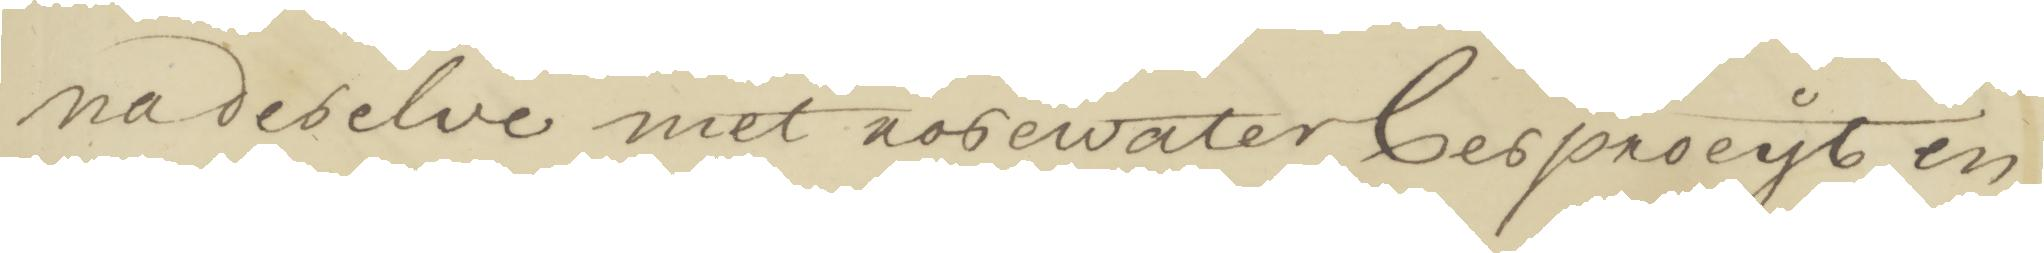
na deselve met rosewater besproeijt en
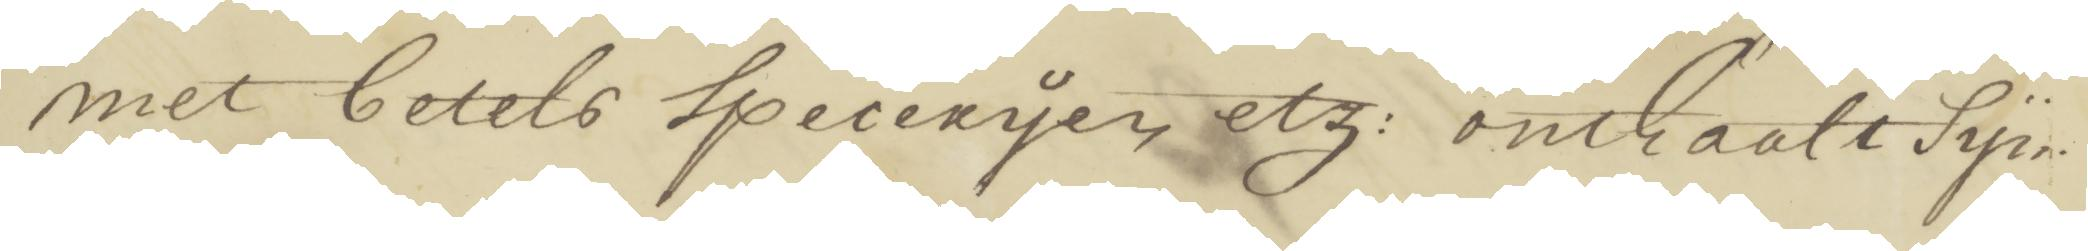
met betels Specerijen etz: onthaalt Sijn.
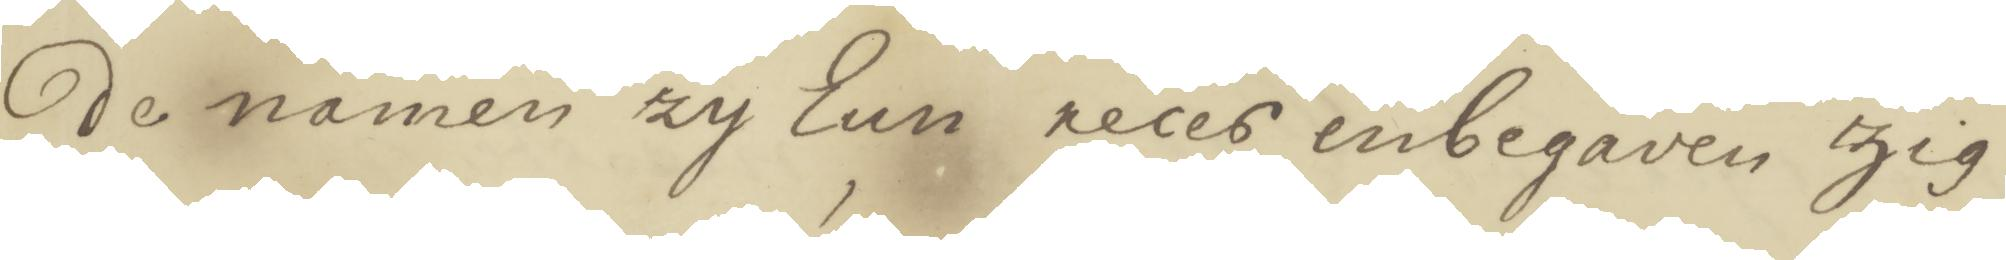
de namen zy hun reces en begaven zig
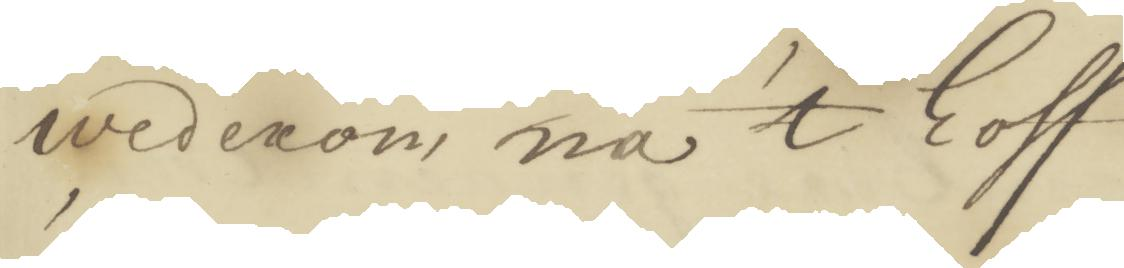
wederom na ’t hoff
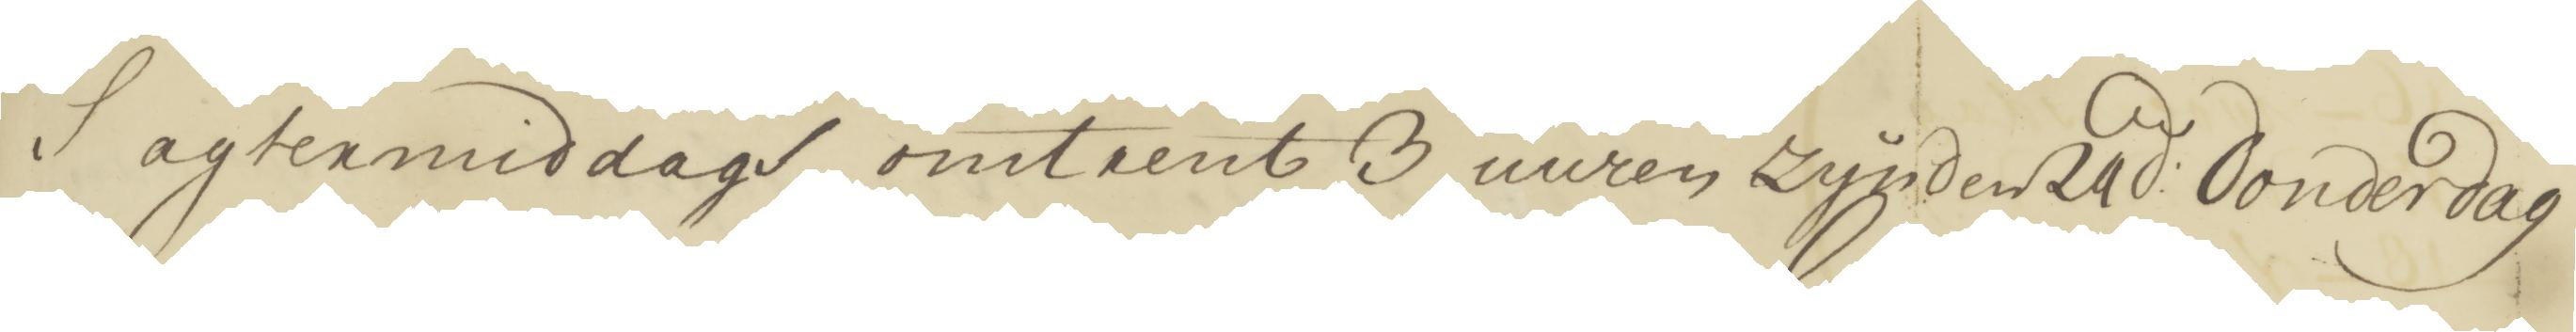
'S agtermiddags omtrent 3 uuren zijn den 24 d:e donderdag
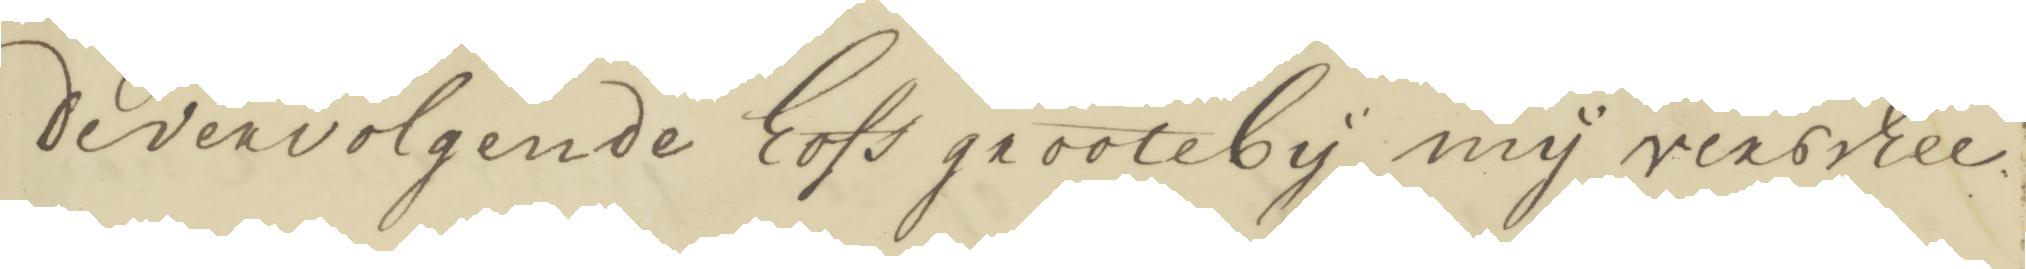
de vervolgende hofs groote bij mij verschee
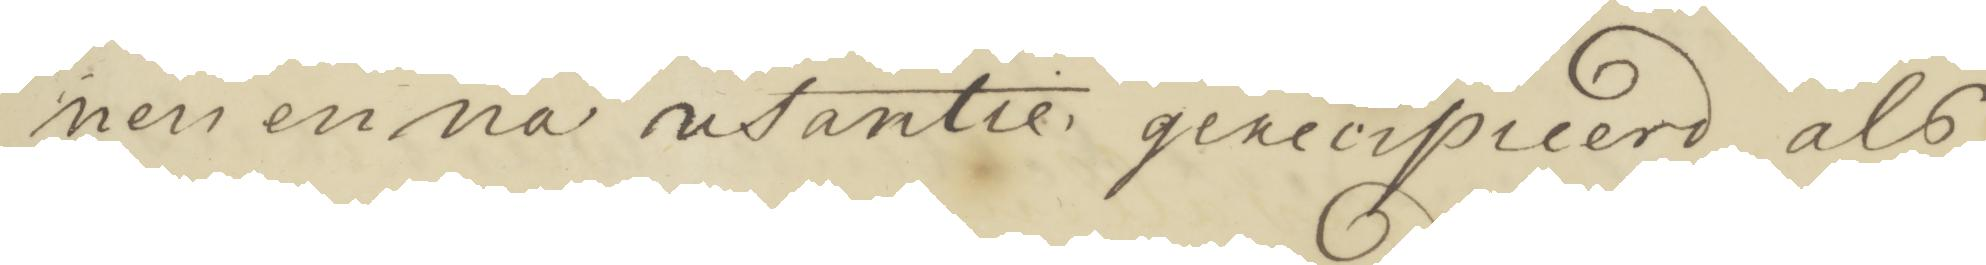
nen en na usantie gerecipieerd als
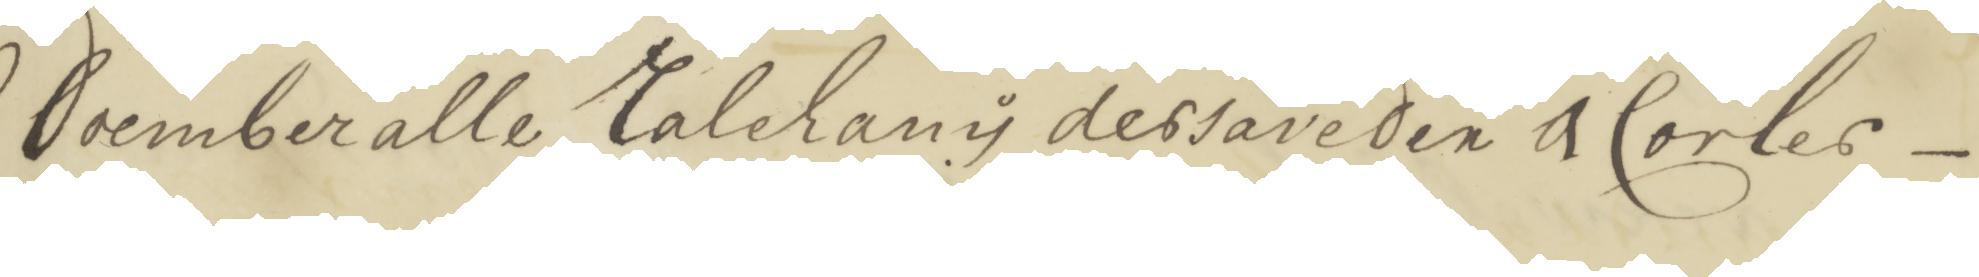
Doember alle Ralehanij dessave der 4 Corles —
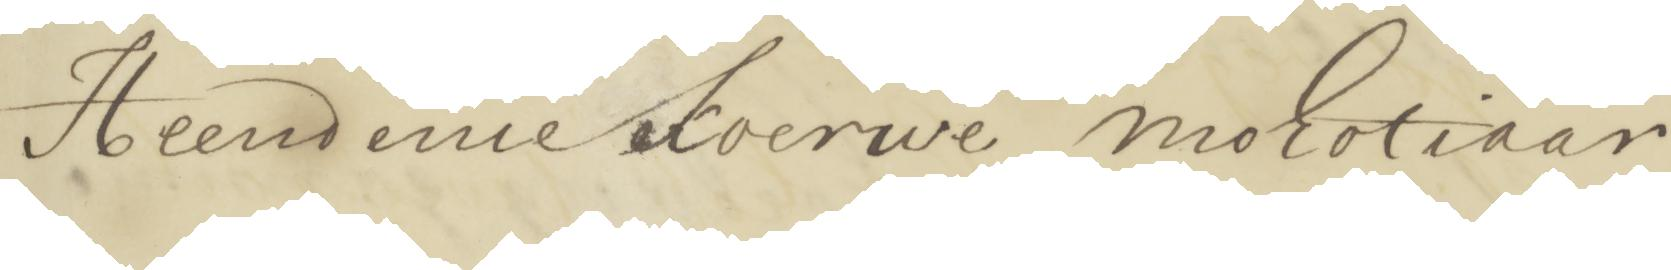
Heendenie Koerwe mohotiaar
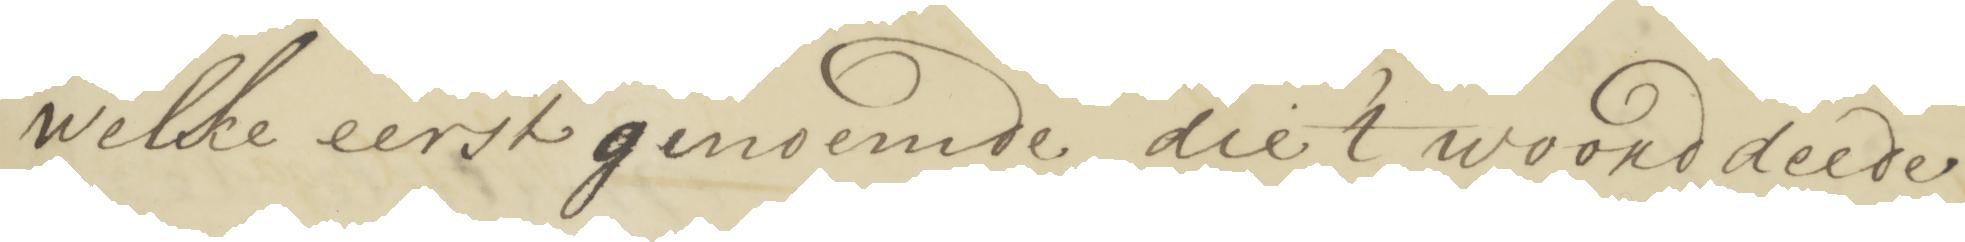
welke eerst genoemde die ’t woord deede
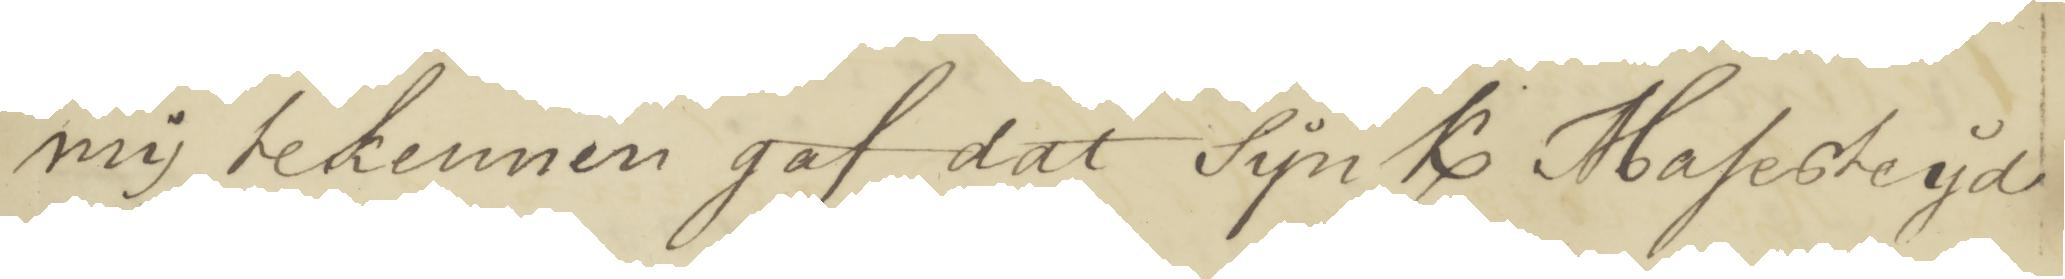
mij tekennen gaf dat sijn K Majesteijd
